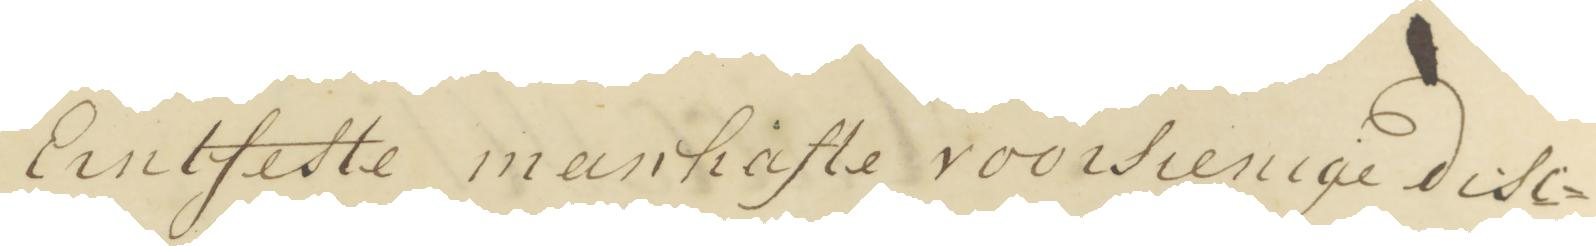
Erntfeste manhafte voorsienige disc=
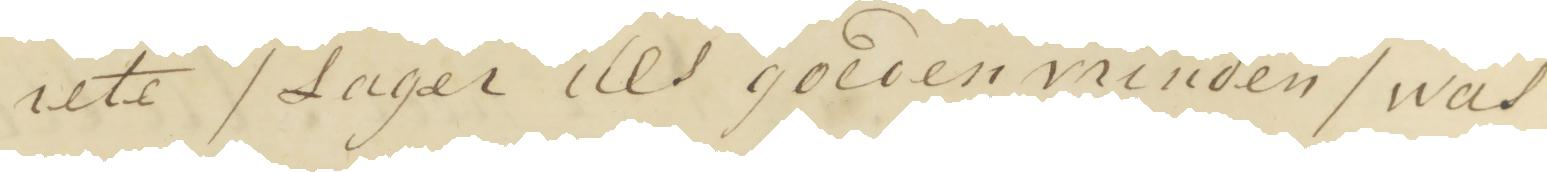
rete / lager des goeden vrinden / was
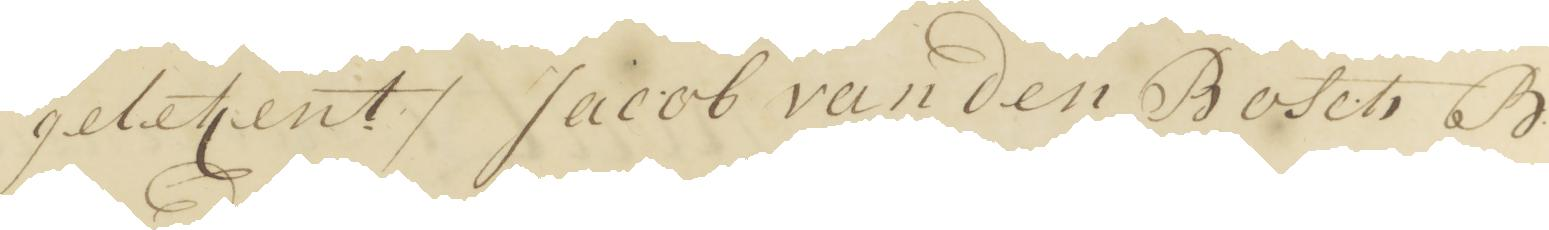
getekent / Jacob van den Bosch B
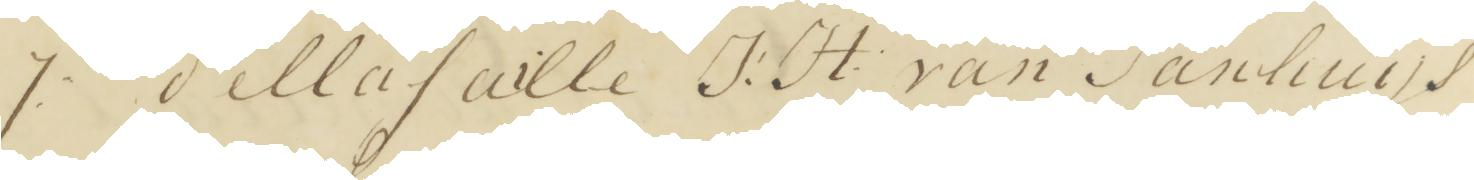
J: della faille I:H: van Panhuijs
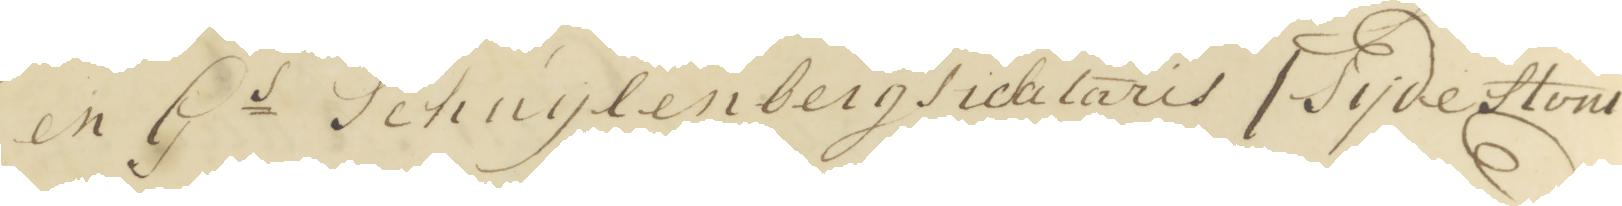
en G=s Schuijlenberg sicketaris / sijde stont
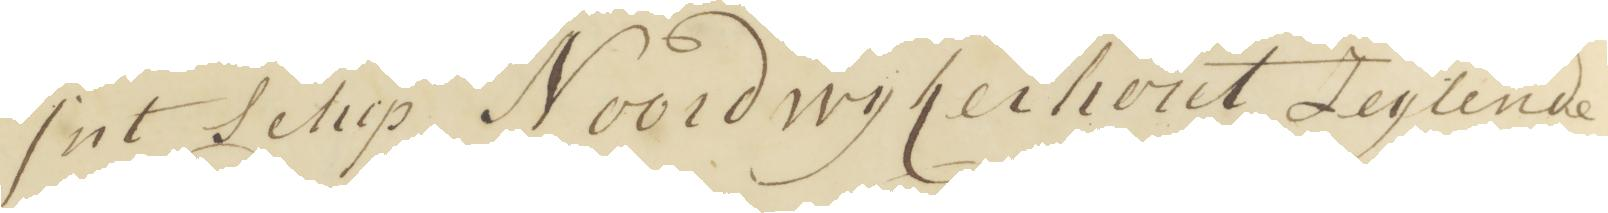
int schip Noordwijkerhout zeylende
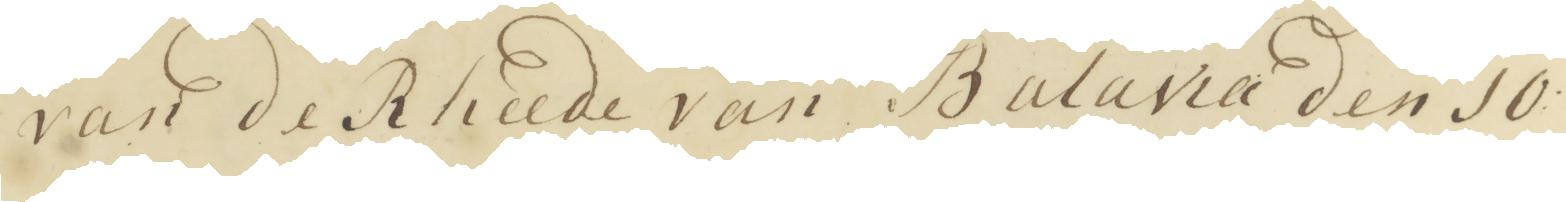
van de Rheede van Batavia den 10:
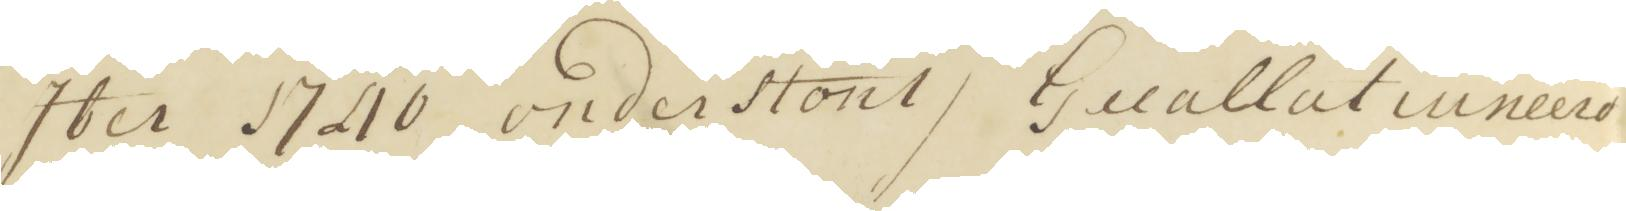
7ber 1740 onderstont / Gecallatiuneerd
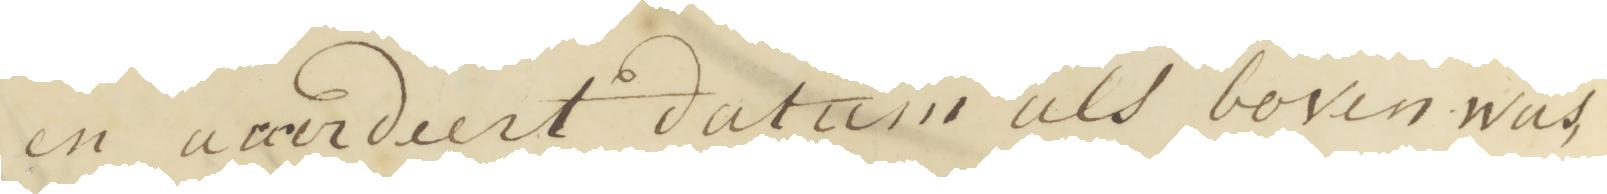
en accordeert datum als boven was,
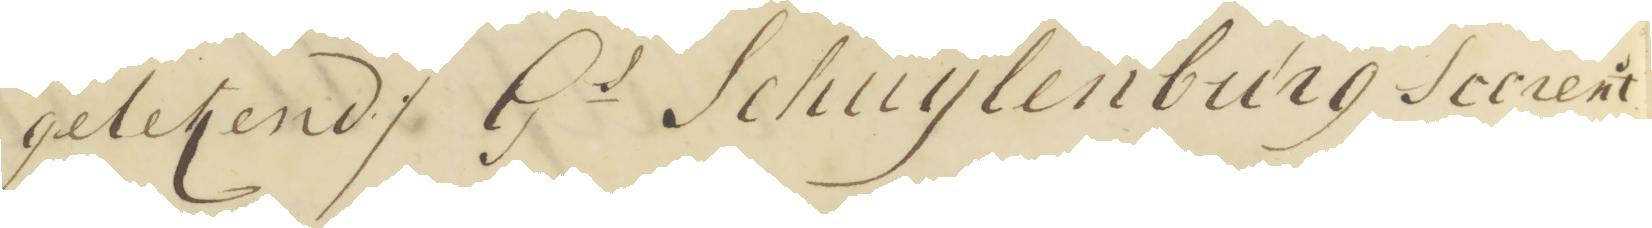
getekend / G-s Schuylenburg Secrent
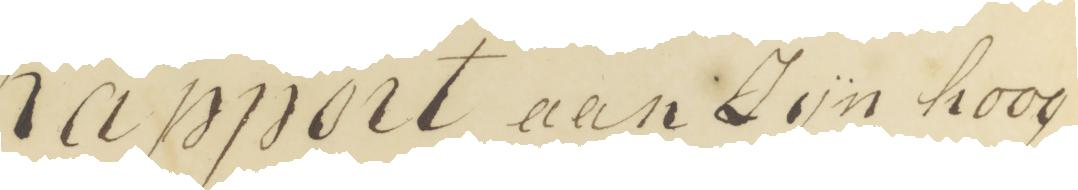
Rapport aan Zijn hoog
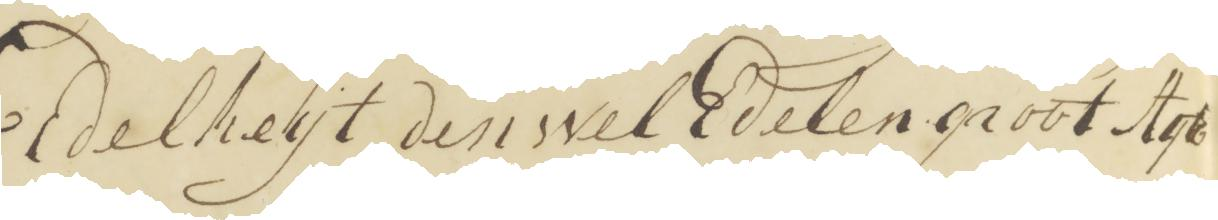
Edelheijt den wel Edelen groot Agtb
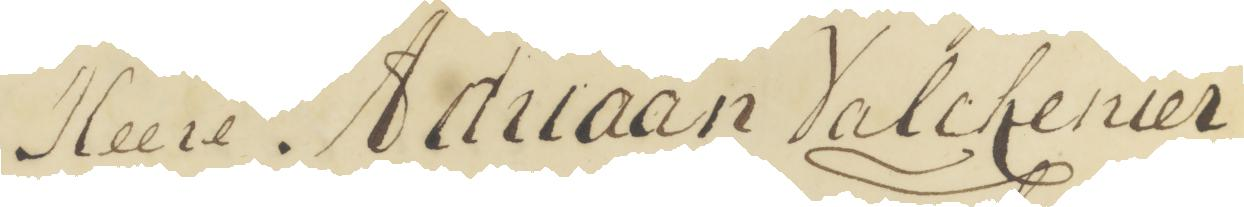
Heere. Adriaan Valckenier
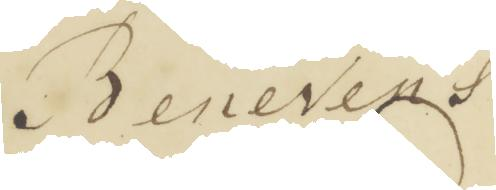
Benevens
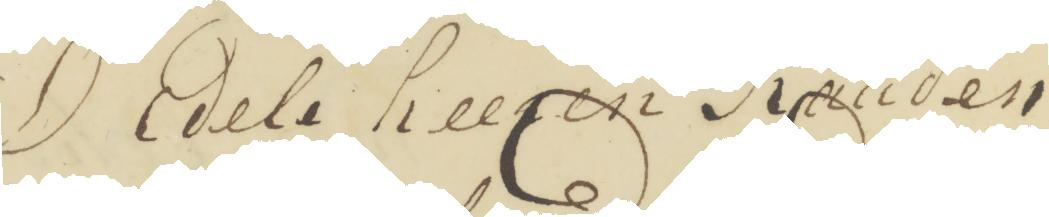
D' Edele heeren Raaden
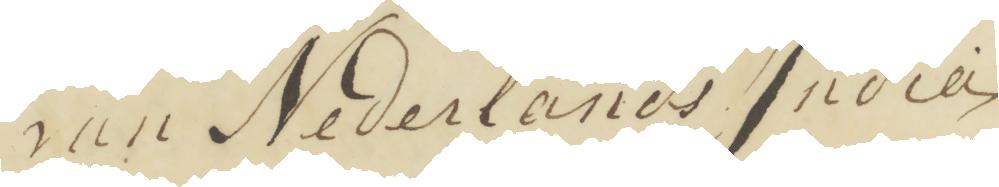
van Nederlands Indien
